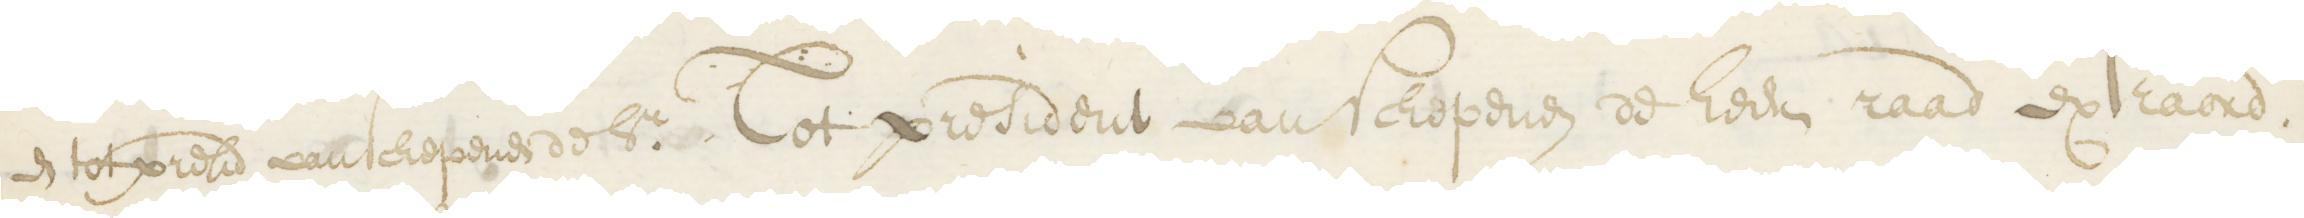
en tot presid van schepenen de h.r Tot president van schepenen de heer raad extraord.s
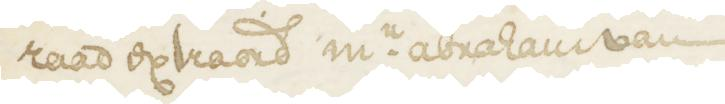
raad extraord m.r abraham van
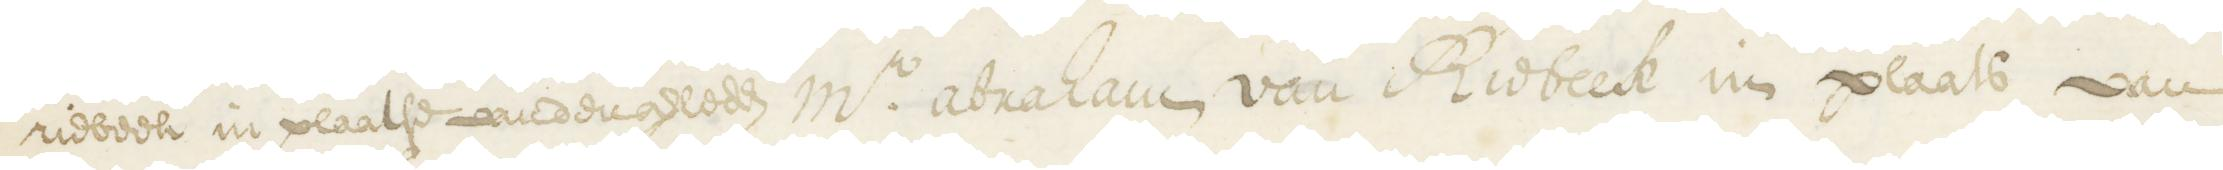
riebeek in plaatse van den overleden M.r abraham van Riebeck in plaats van
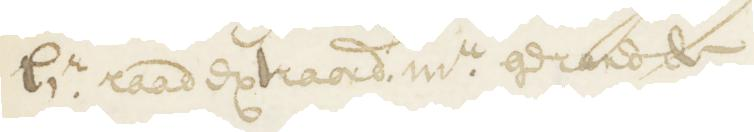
H:r raad extraord. m.r gerard
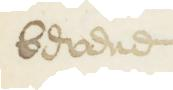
bevere
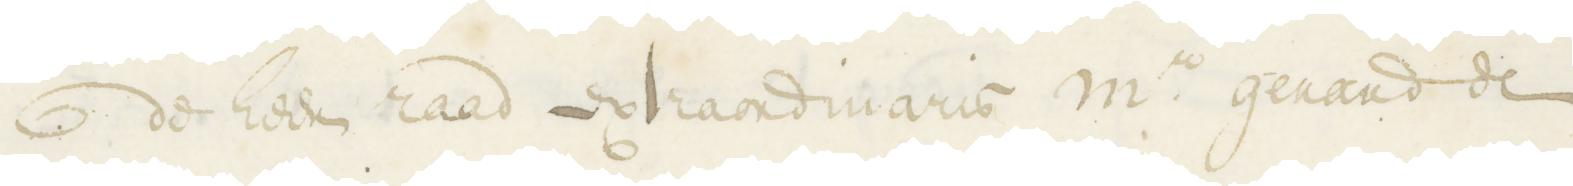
de heer raad extraordinaris m:r gerard de
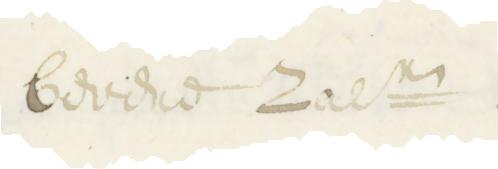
bevere zal=r
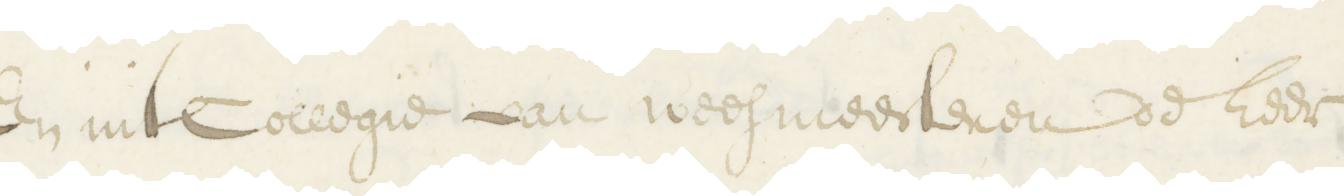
En in't Collegie van weesmeerleren de heer
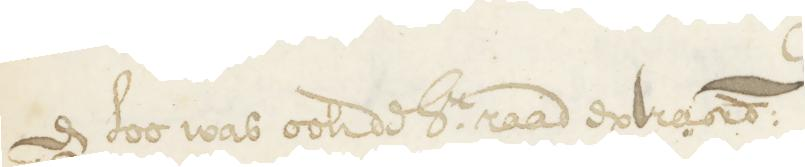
En soo was ook de h.r raad extraord:
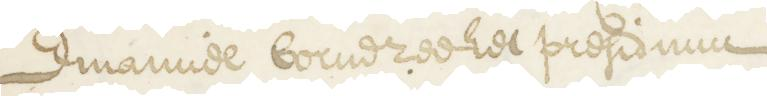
Emanuel bornezee het presidium
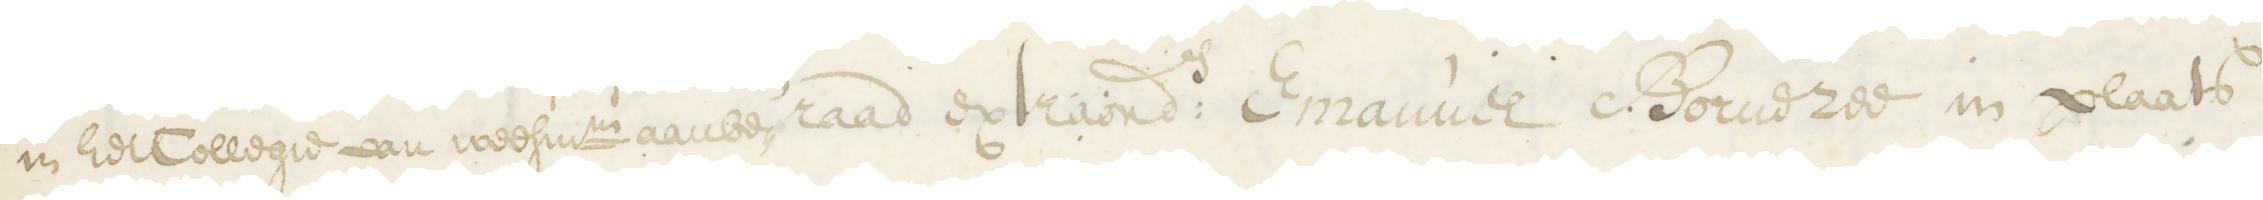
in het Collegie van weesm=m aan be„ raad extraord:s Emanuel Bornezee in plaats
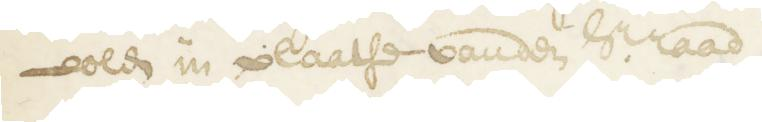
volen in plaatse van den h.r raad
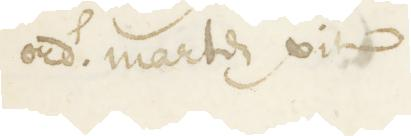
ord.s marten pit
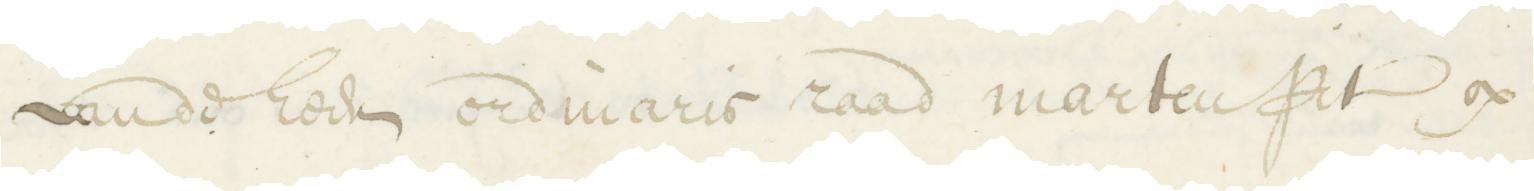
van de heer ordinaris raad marten Pit op
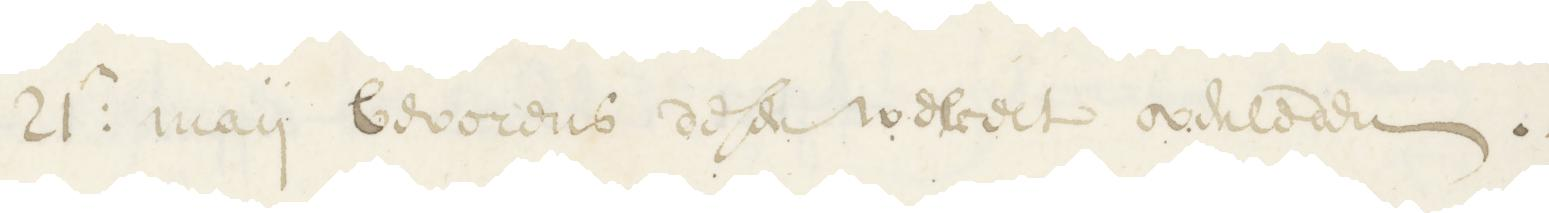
21:en maij bevorens deser werelt verleden.
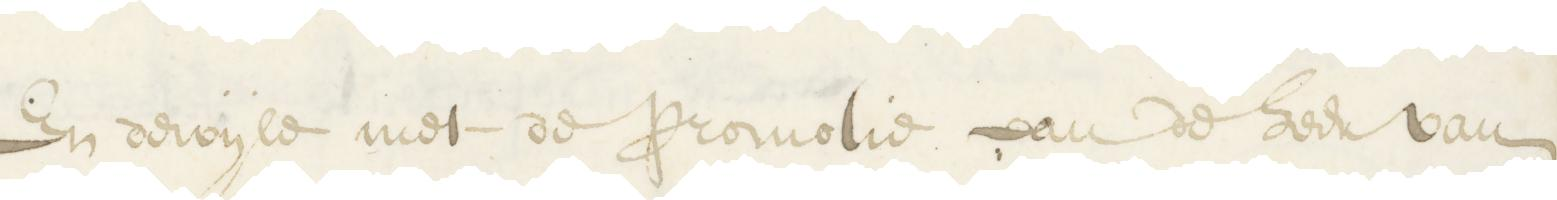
En dewijle met de promotie van de heer van
